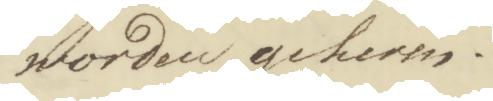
worden geheven.
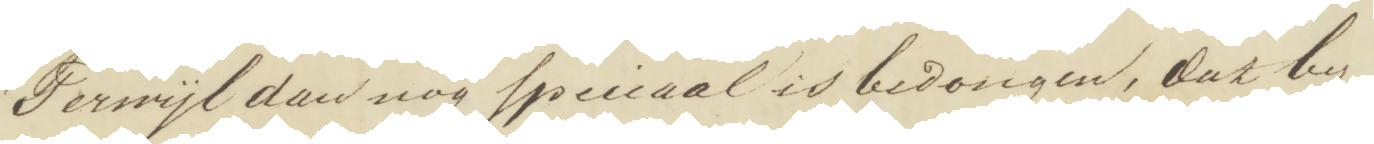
Terwijl dan nog speciaal is bedongen, dat by
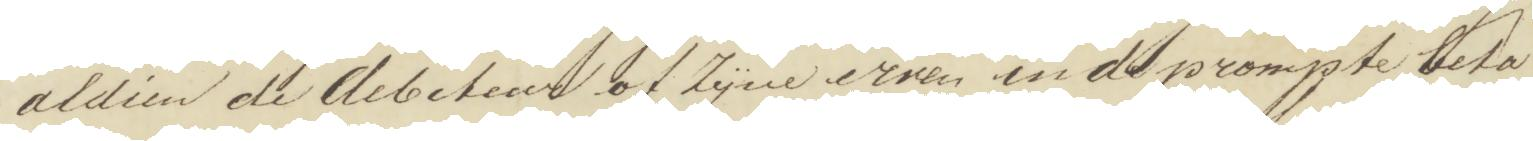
aldien de debiteur of zijne erven in de prompte beta
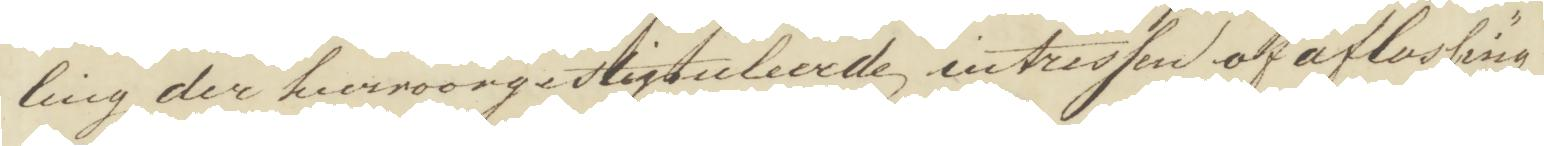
ling der hiervoor gestipuleerde intressen of aflossing
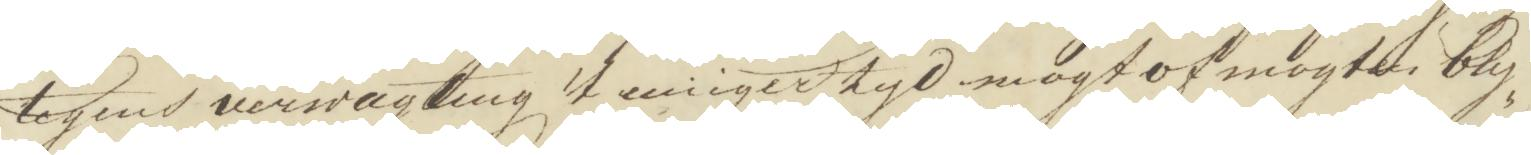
tegens verwagting ’t eeniger tyd mogt of mogten bly„
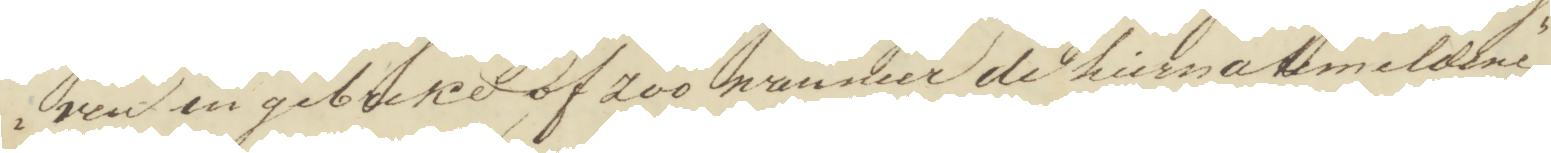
„ven in gebreke of zoo wanneer de hierna te meldene
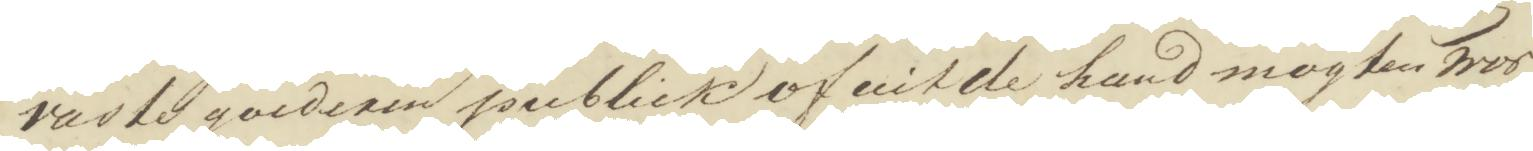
vaste goederen publiek of uit de hand mogten wor
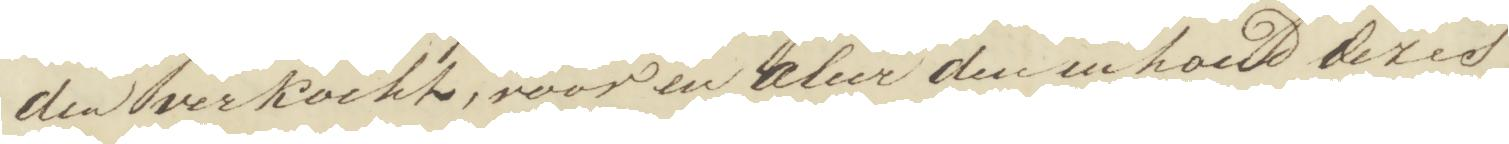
den verkocht, voor en aleer den inhoud dezes
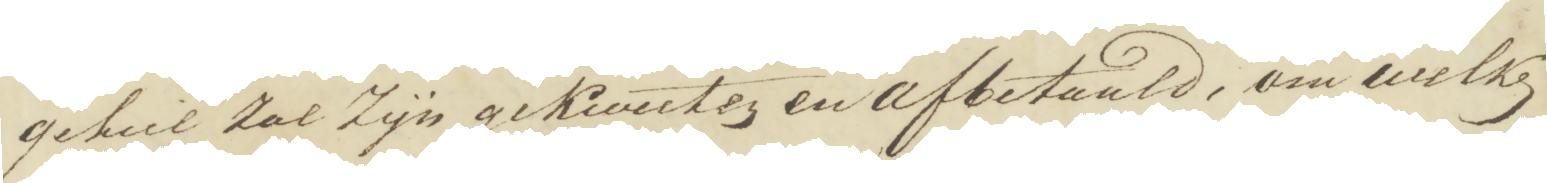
geheel zal zijn gekweeten en afbetaald, om welke
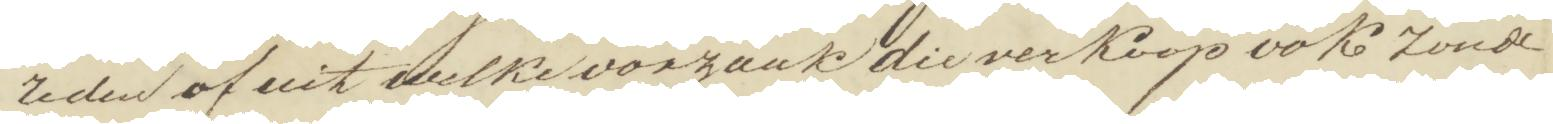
reden of uit welke oorzaak die verkoop ook zoude
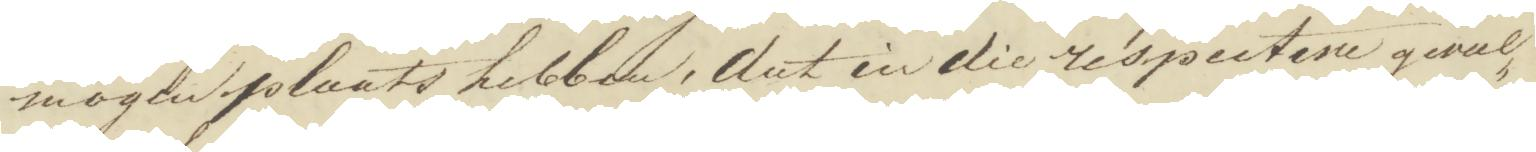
mogen plaats hebben, dat in die respective geval„
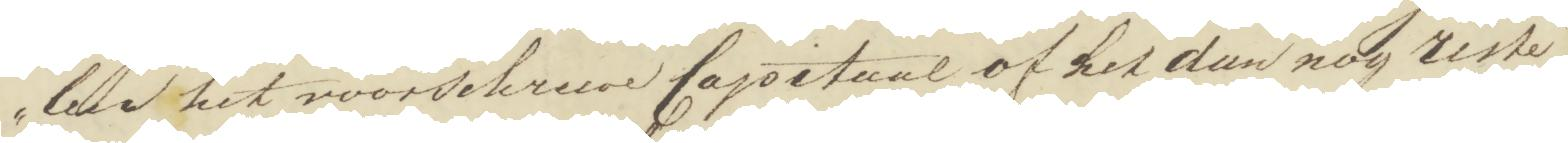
„len het voorschreeve Capitaal of het dan nog reste
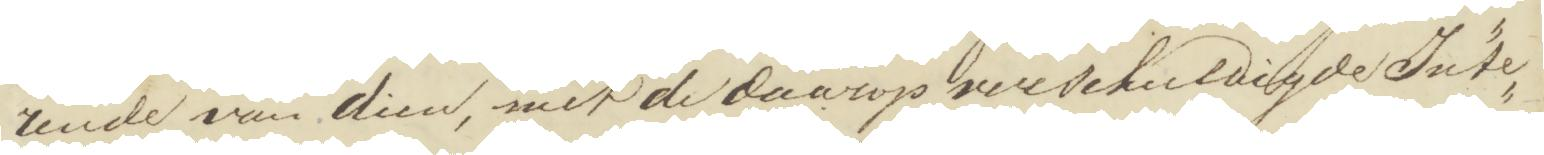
rende van dien, met de daarop verschuldigde Inte„
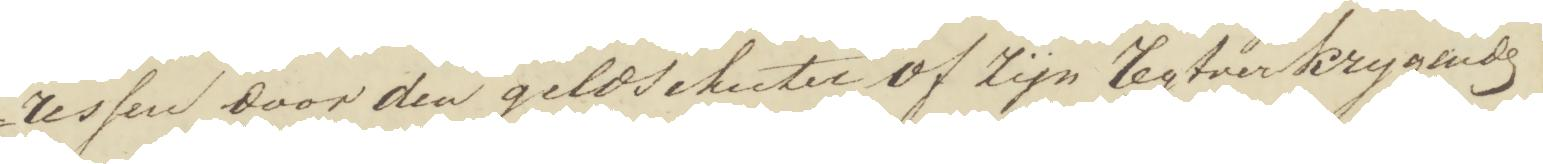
„ressen door den geldschieter of zijn regt verkrygende
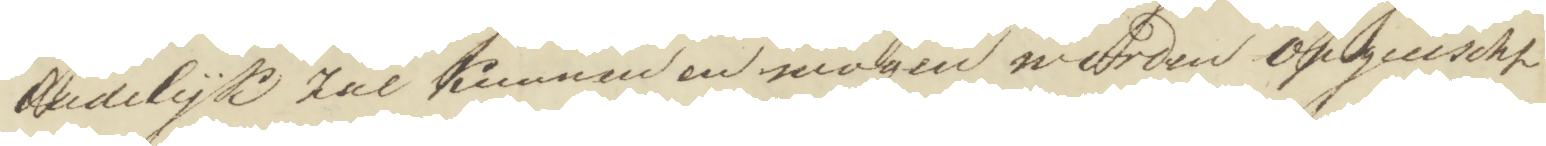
dadelijk zal kunnen en mogen worden opgeeischt
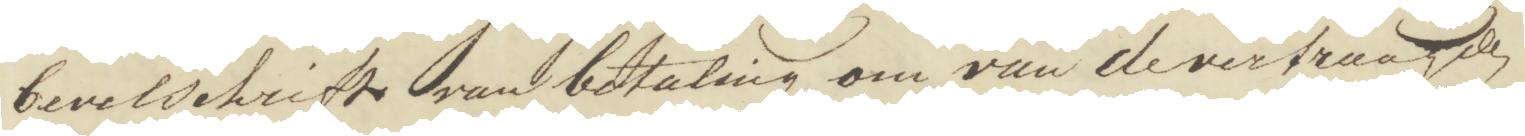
bevelschrift van betaling om van de vertraagden
